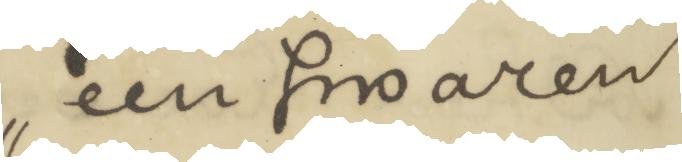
een swaren
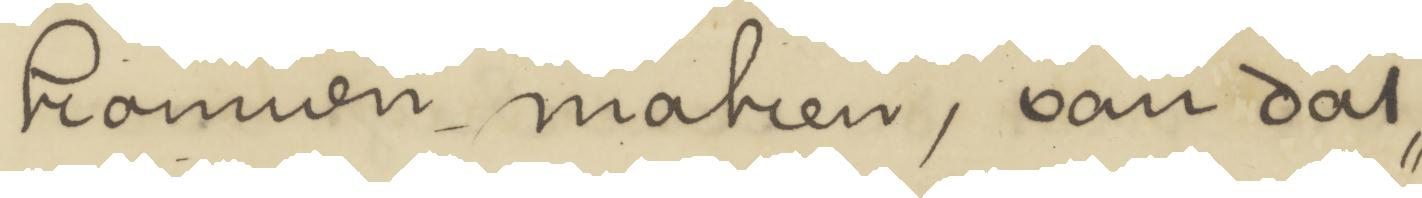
konnen maken, van dat„
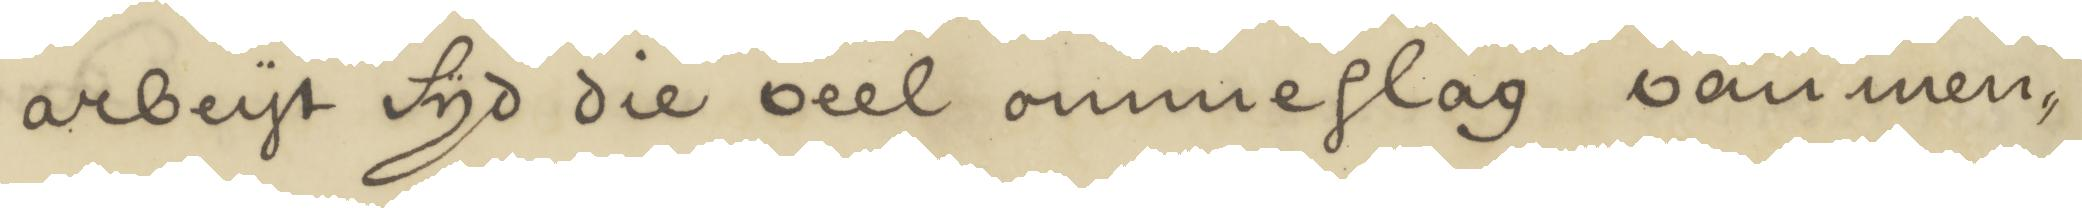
arbeijt sijd die veel ommeslag van men„
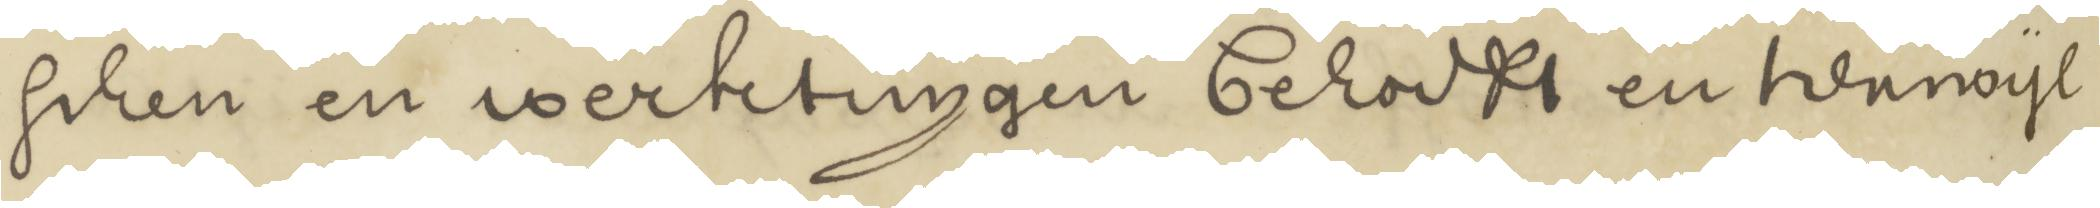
schen en werktuijgen behoeft en terwijl
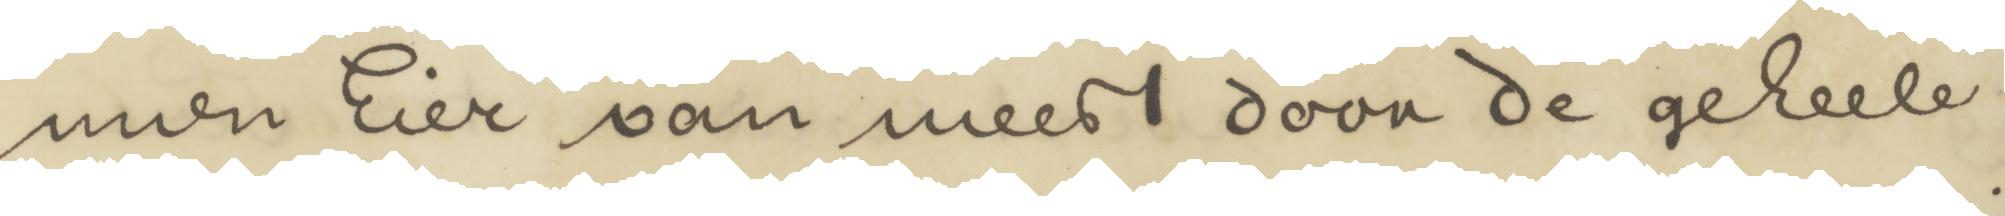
men hier van meest door de geheele
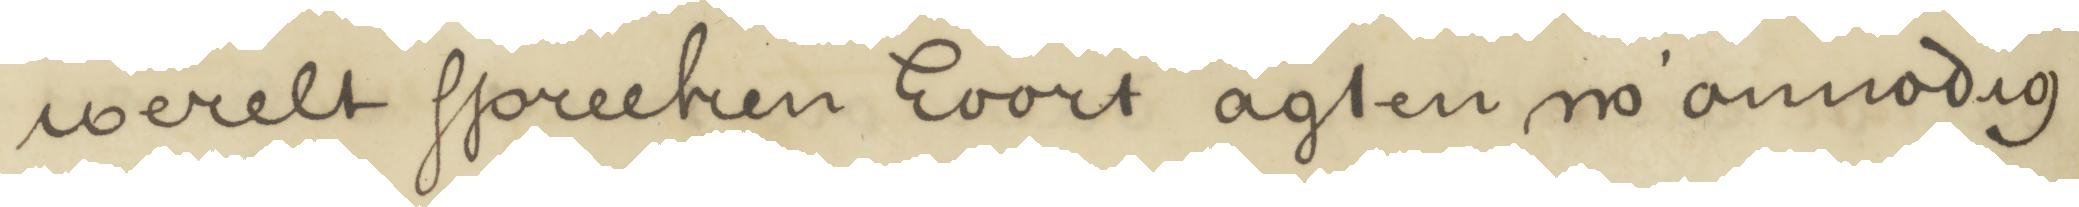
werelt spreeken hoort agten w'onnodig
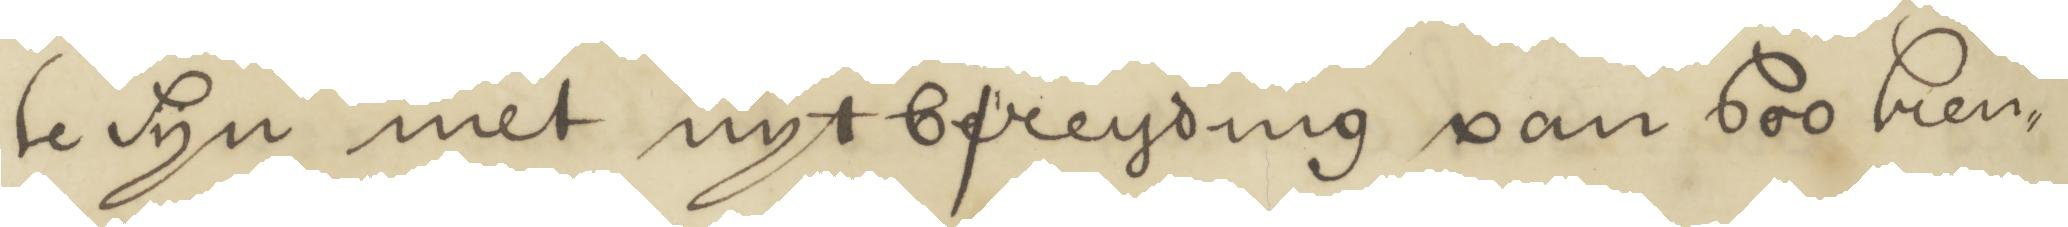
te Sijn met uijt bereyding van soo ken„
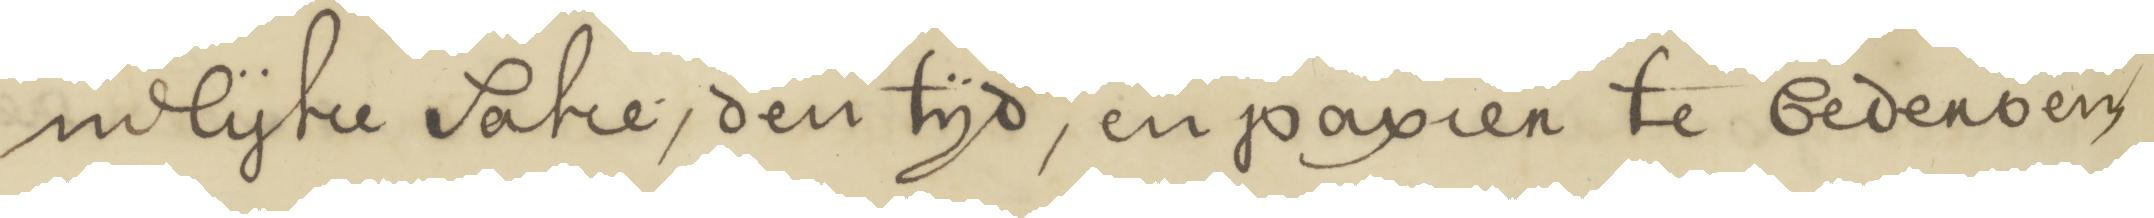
nelijke sake, den tijd, en papier te bederven,
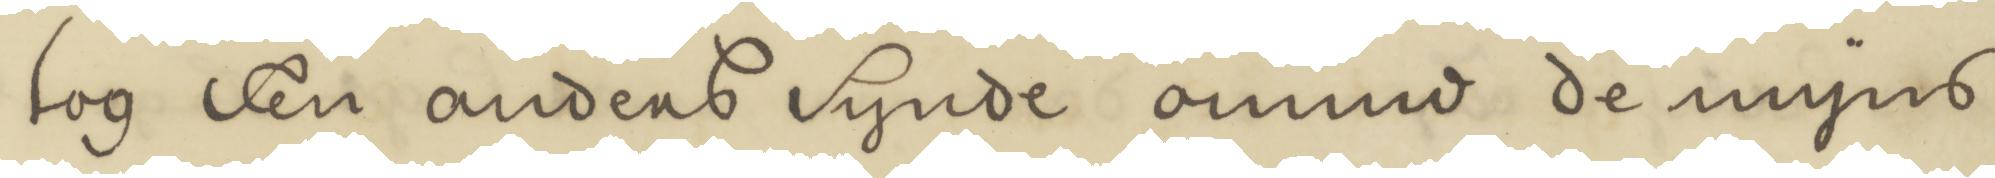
tog Een anders Synde omme de mijns
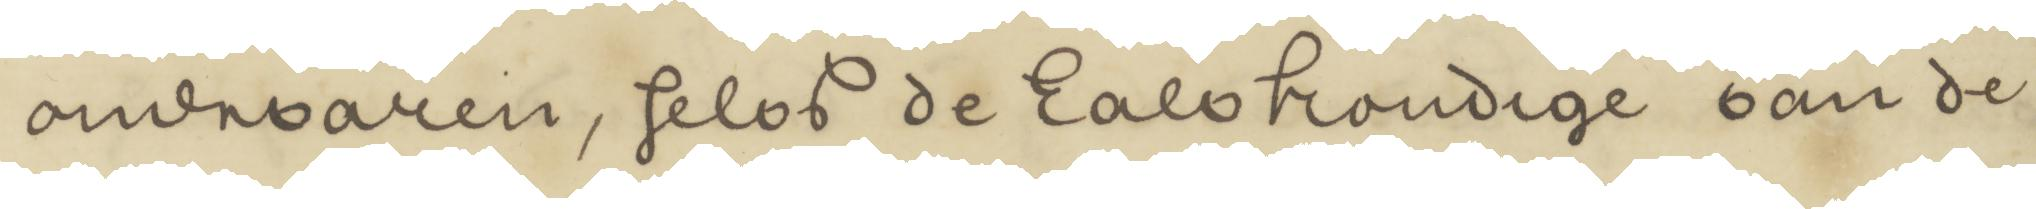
onervaren, selvs de halvkondige van de
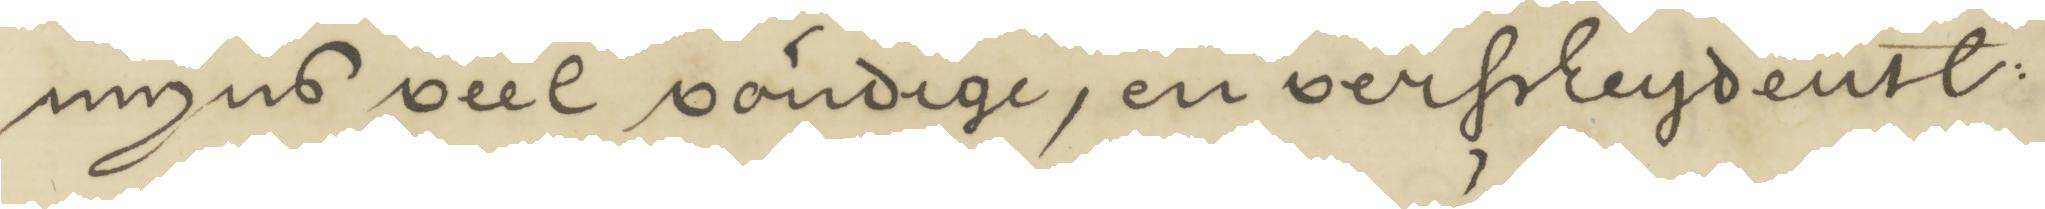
myns veel voudige, en verscheydentlijk:
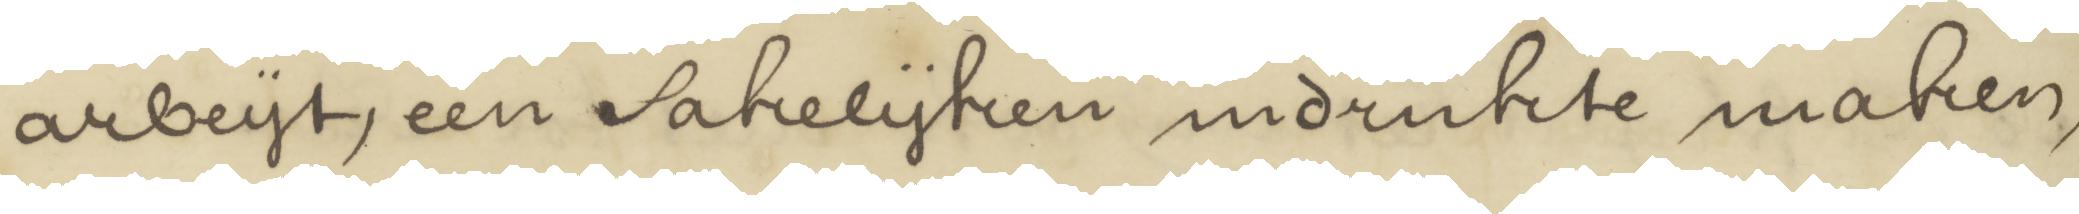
arbeijt, een sakelijken indrukte maken,
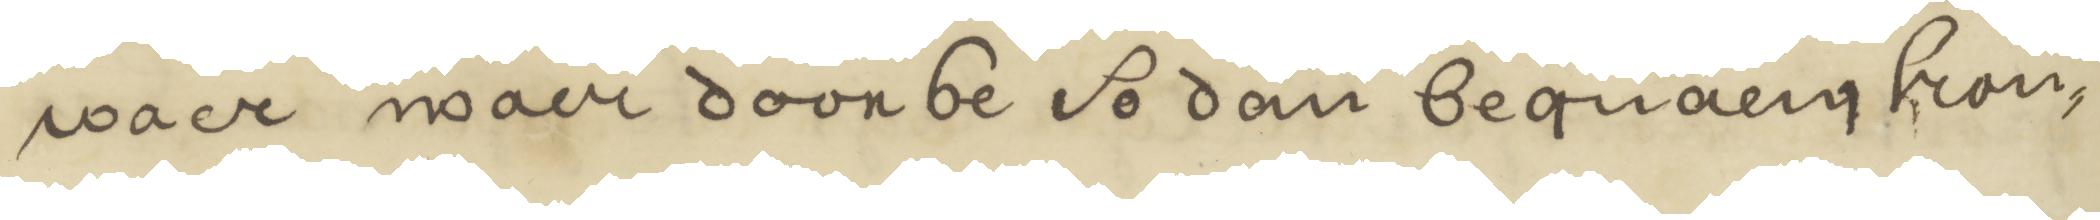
waer naer door se So dan bequaem kon„
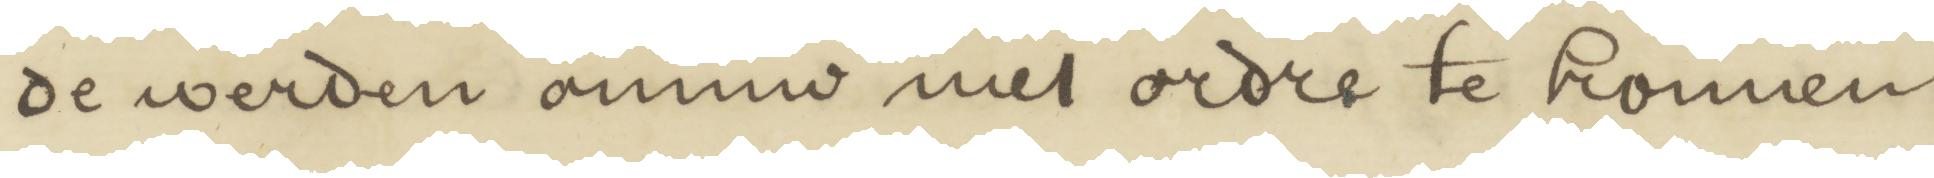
de werden omme met ordre te konnen
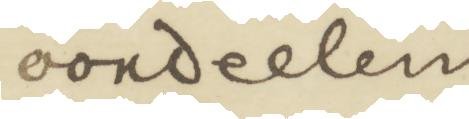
oordeelen
